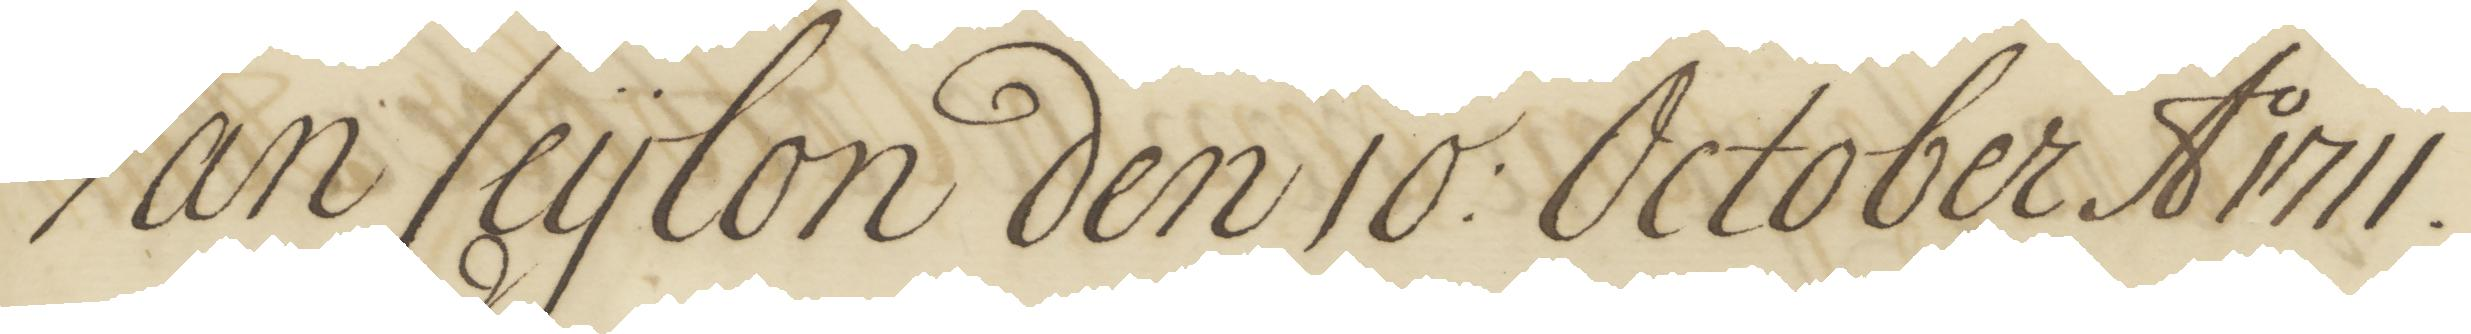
Van Ceijlon den 10: October Ao 1711.
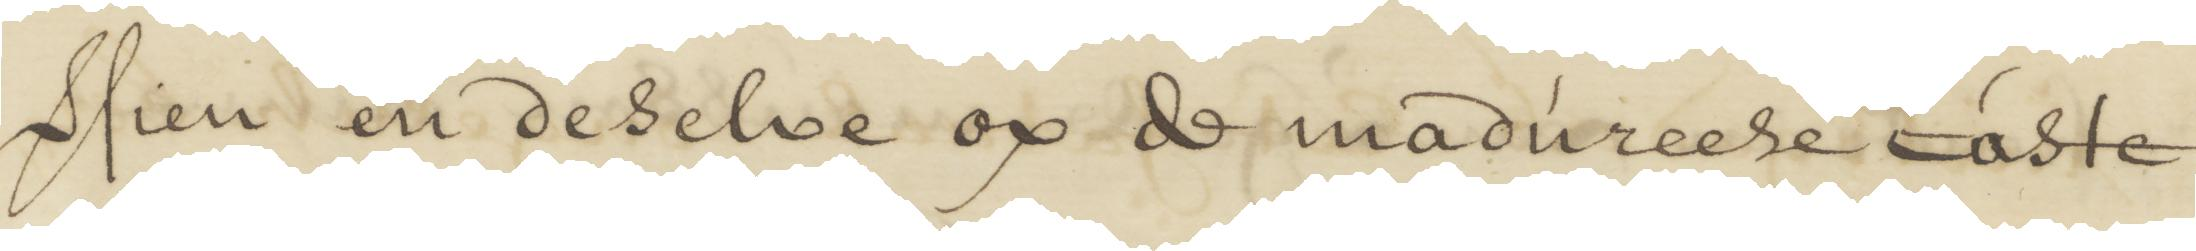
versien en deselve op de madureese custe
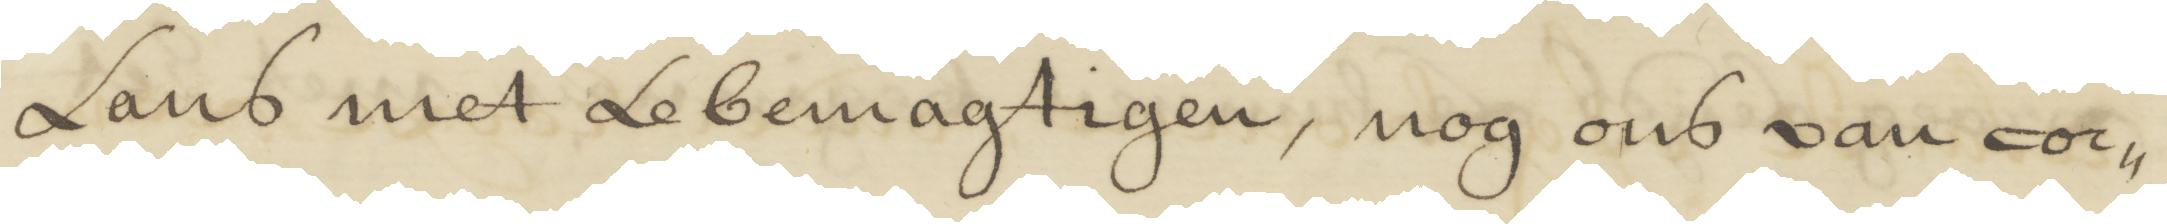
tans niet te bemagtigen, nog ons van cor„
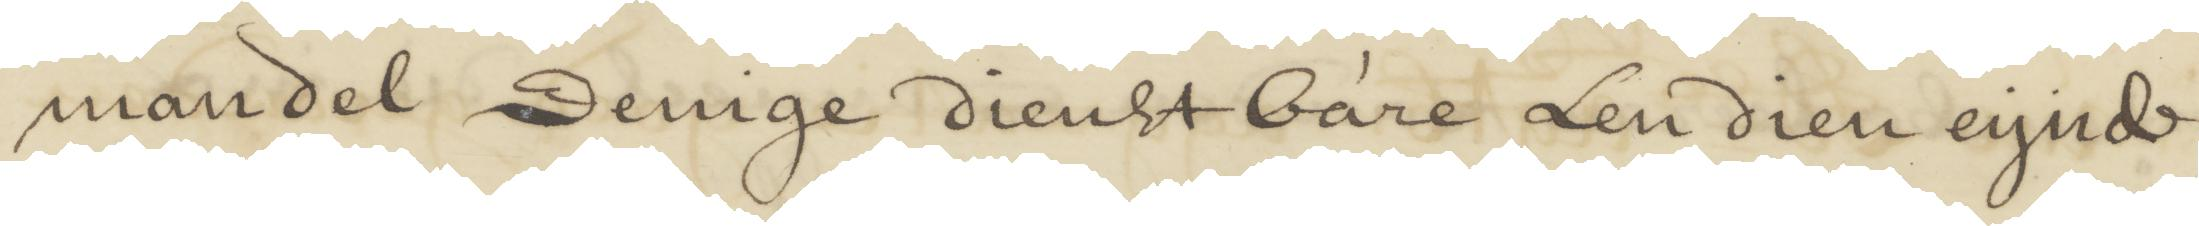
mandel Eenige dienstbare ten dien eijnde
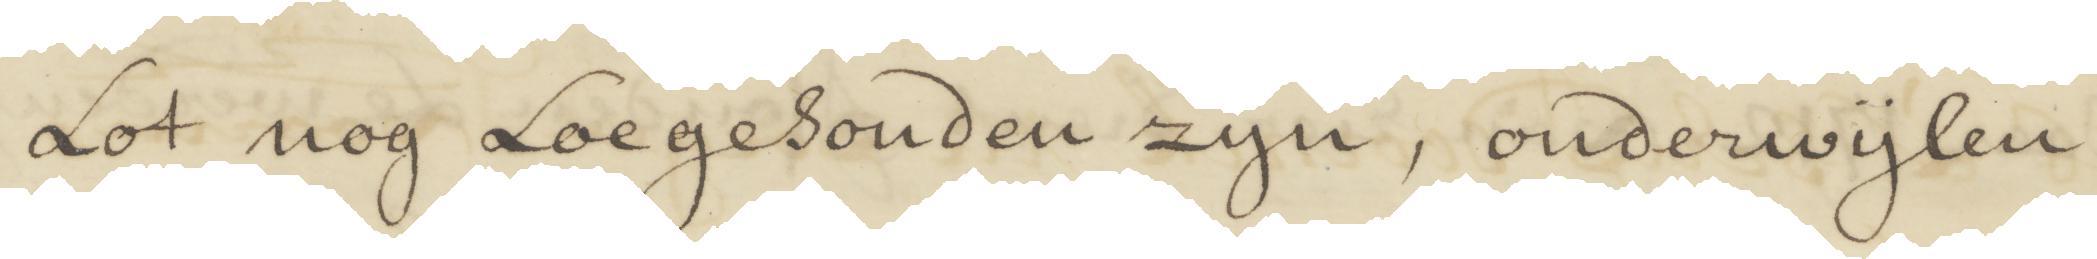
tot nog toegesonden zijn, onderwijlen
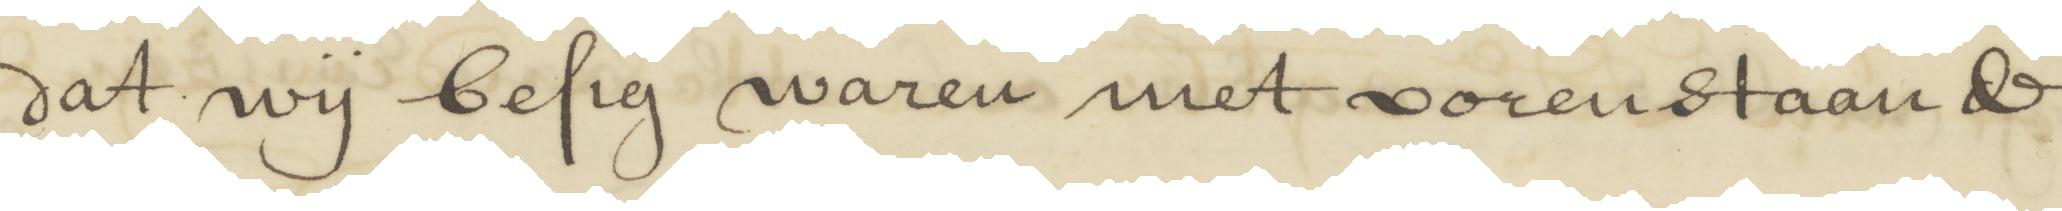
dat wij besig waren met vorenstaan de
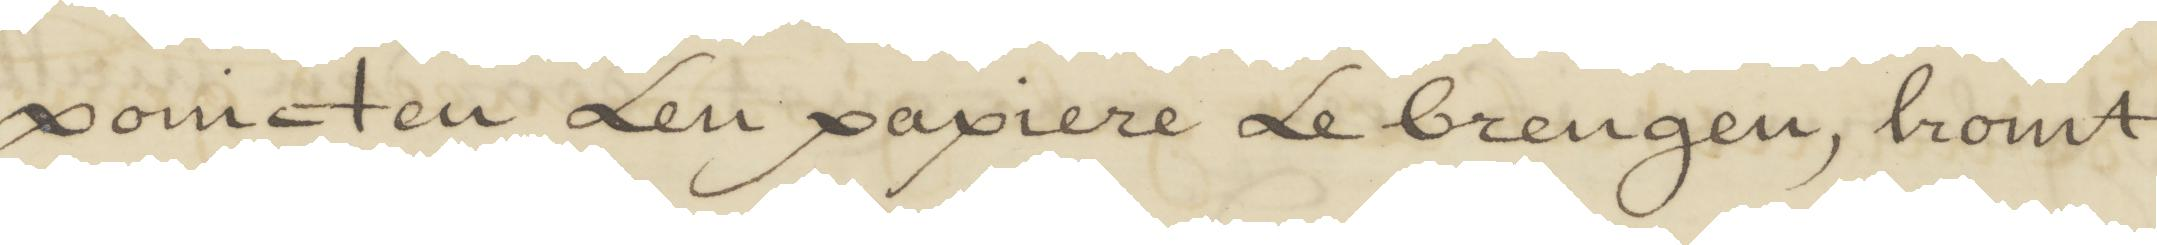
poincten ten papiere te brengen, komt
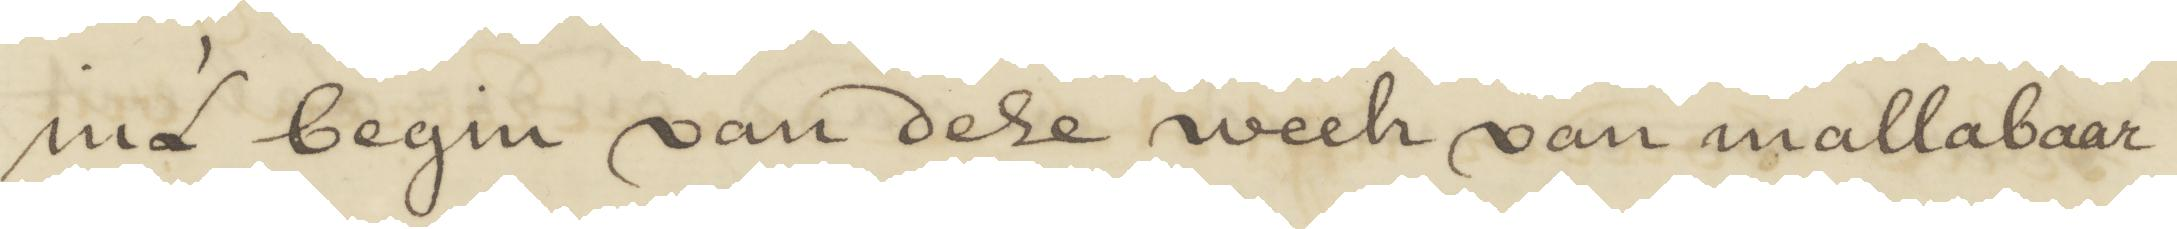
in 't begin van deze week van mallabaar
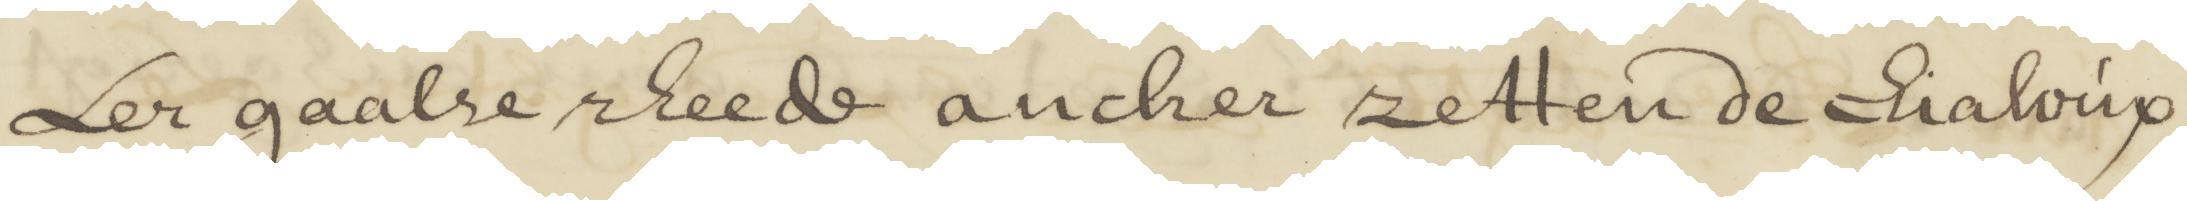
ter gaalse rheede ancker zetten de chialoup
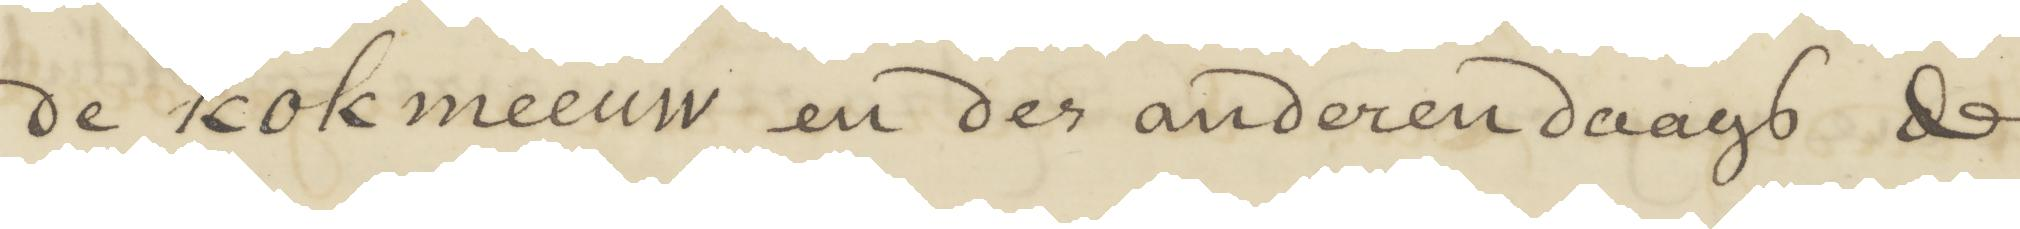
de kokmeeuw en der anderendaags de
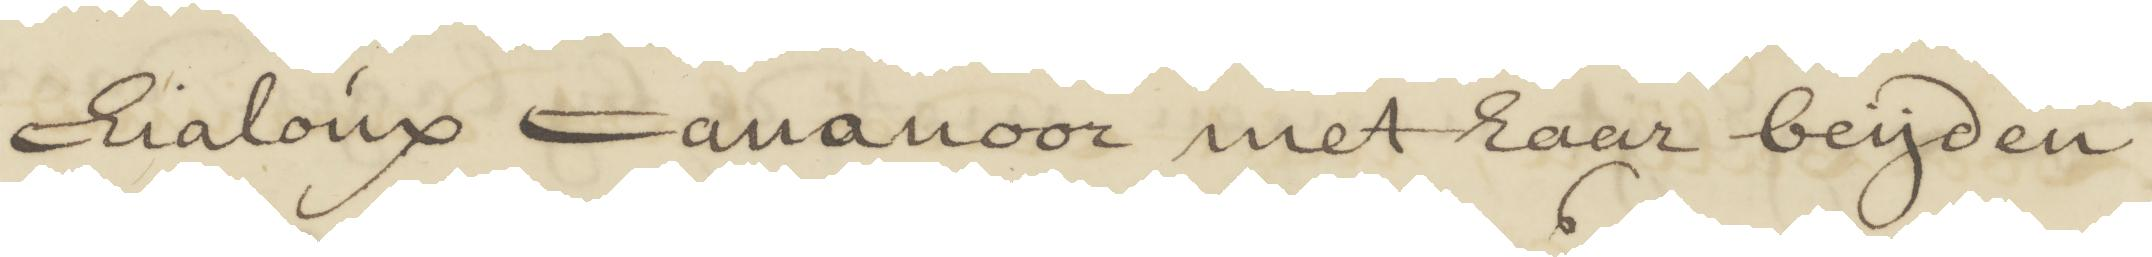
chialoup cananoor met haar beijden
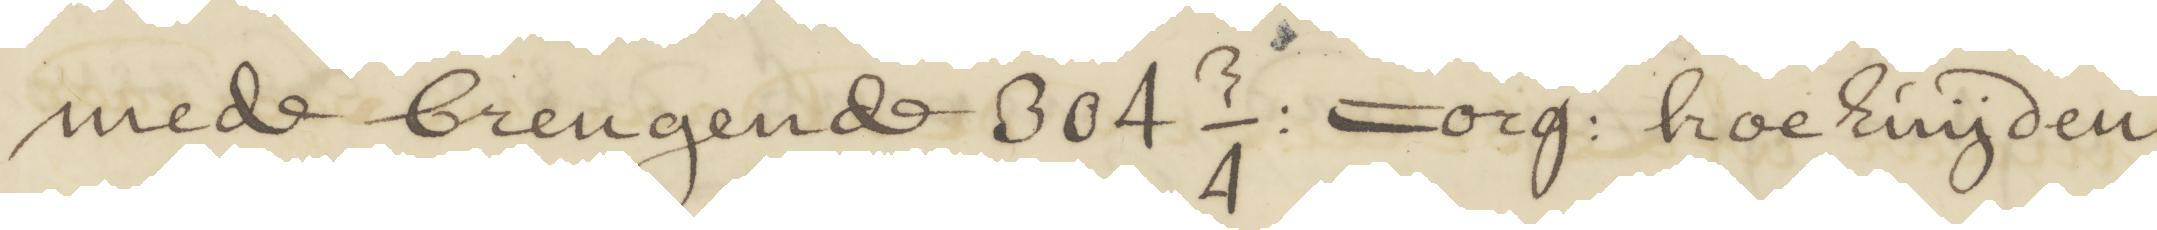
mede brengende 304¾: corg:s koehuijden
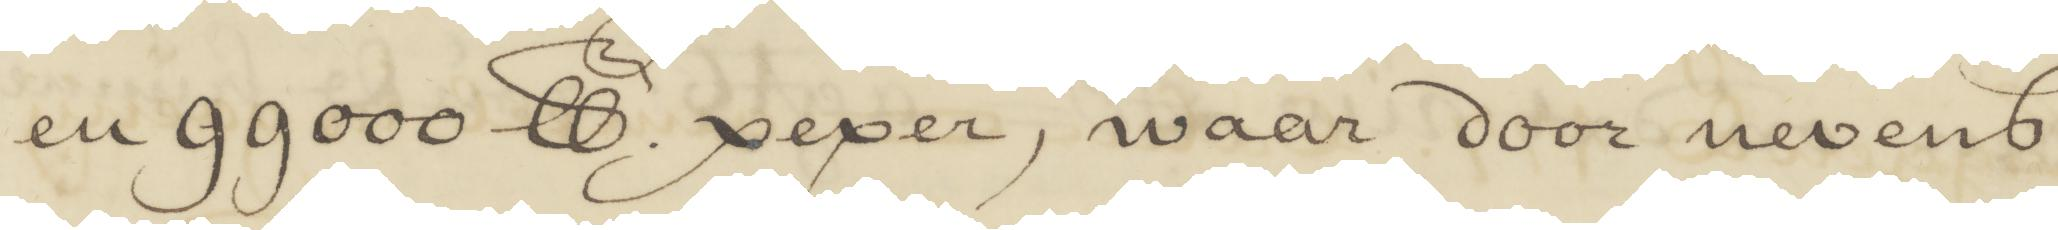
en 99000 lb. peper, waar door nevens
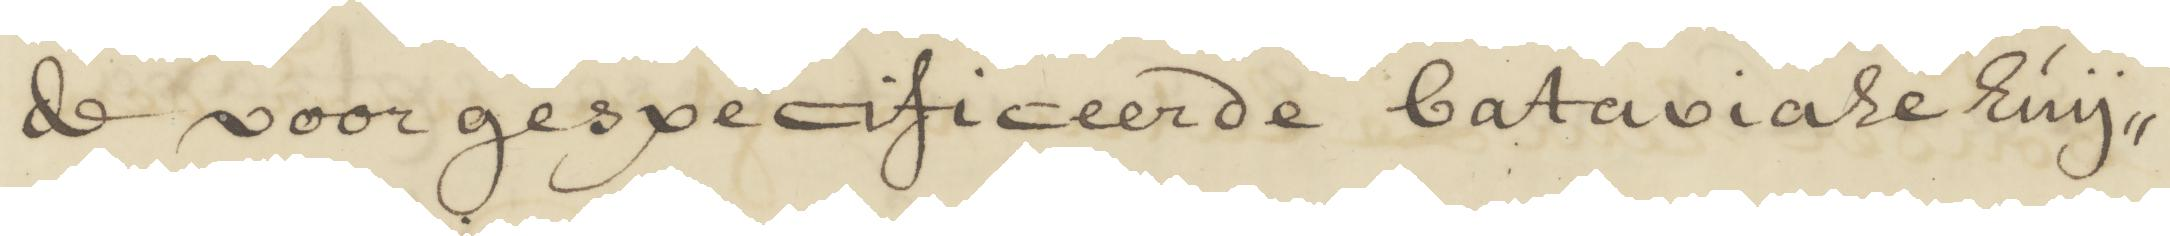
de voor gespecificeerde bataviase huij„
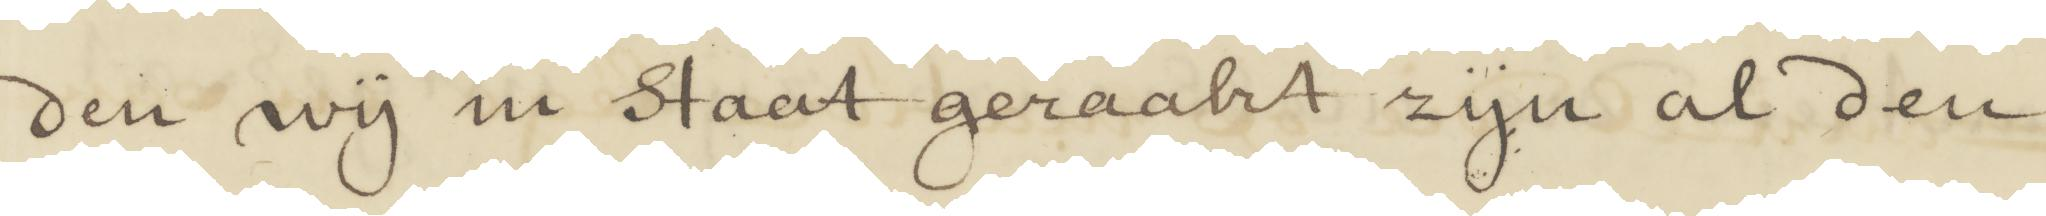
den wij in staat geraakt zijn al den
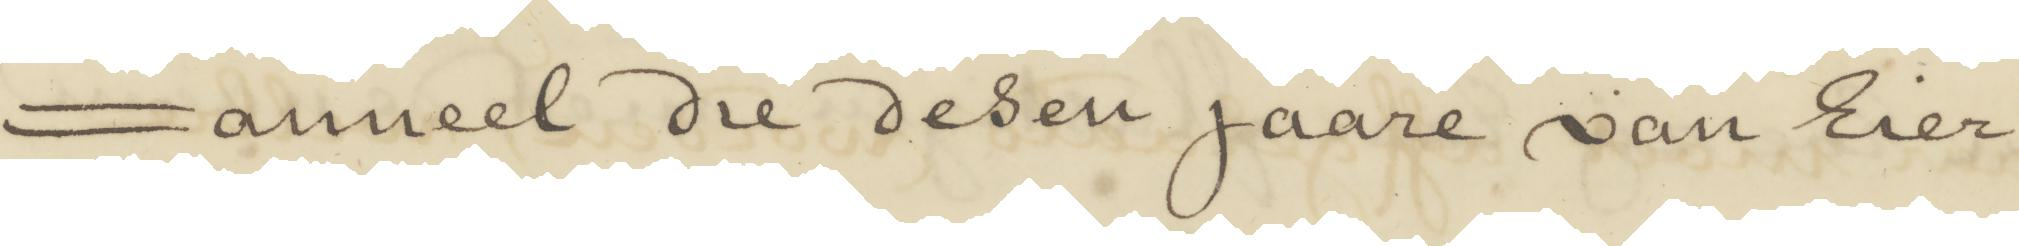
canneel die desen jaare van hier
